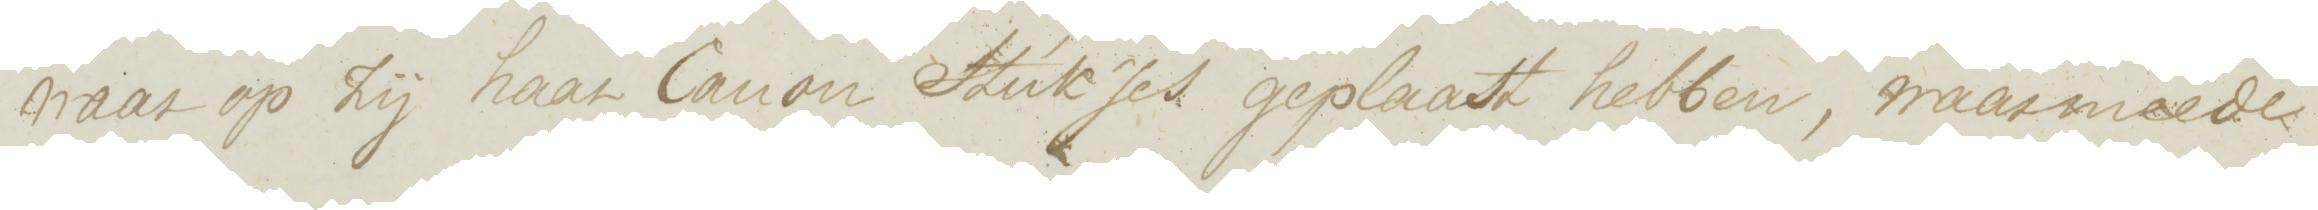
waar op zij haar Canon stukjes geplaast hebben, waarmeede
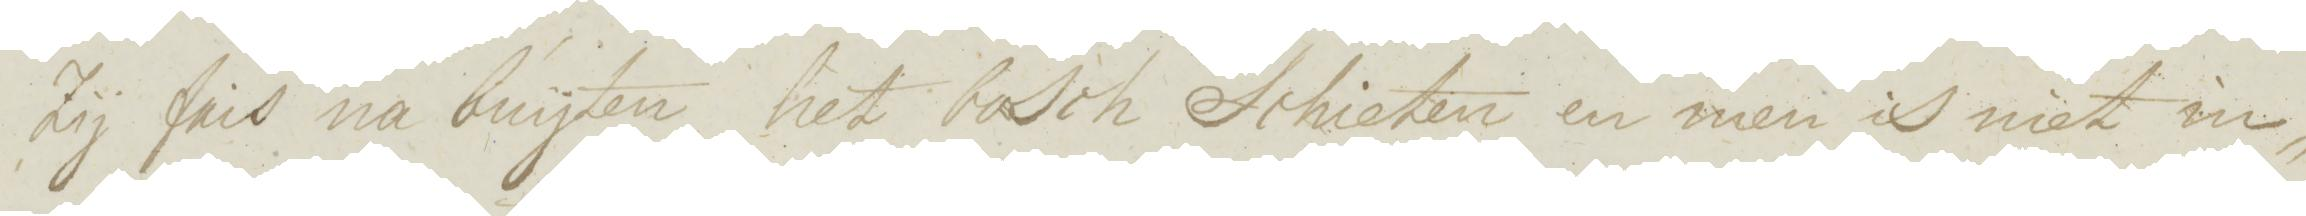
zij fris na buijten het bosch schieten en men is niet in
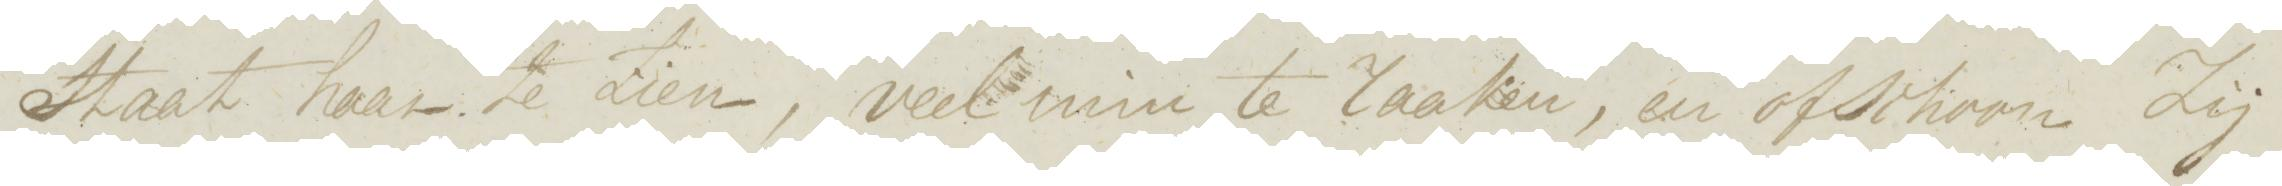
staat haar te zien, veel min te raaken, en ofschoon zij
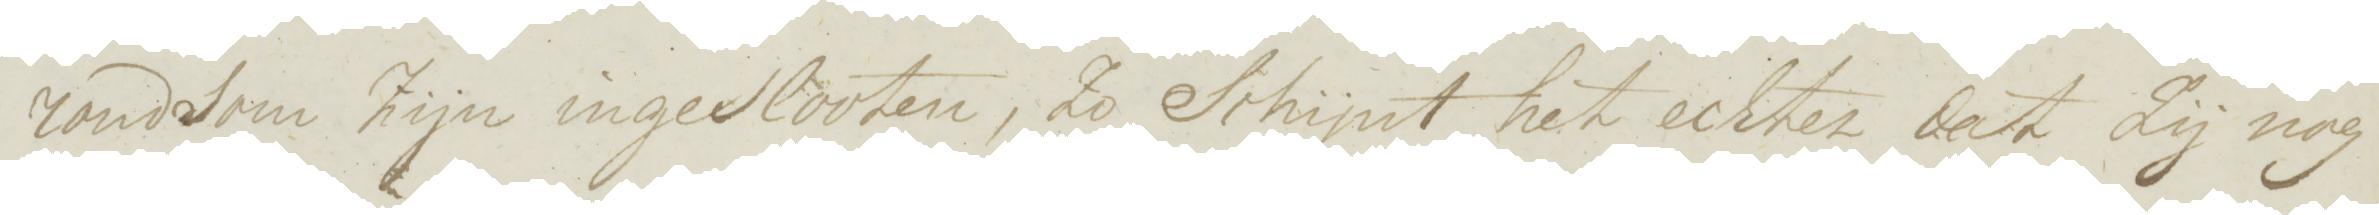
rondsom zijn ingeslooten, zo schijnt het echter dat zij nog
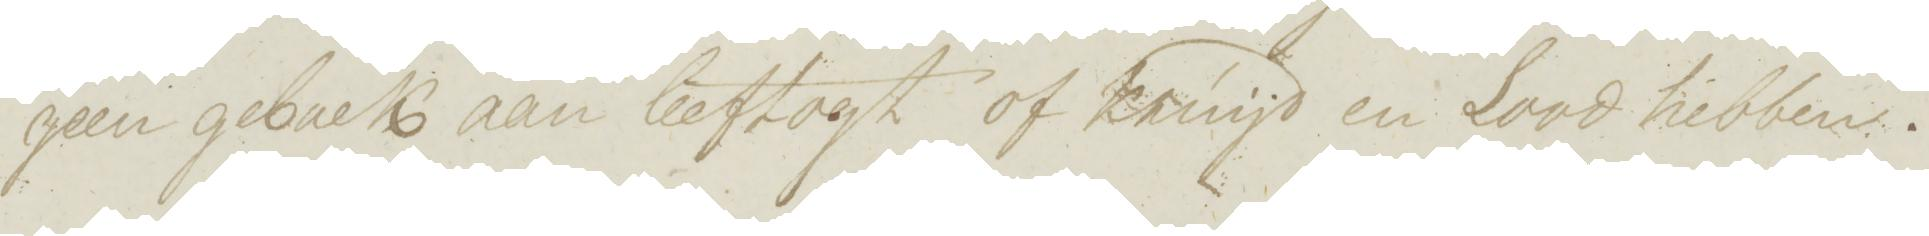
geen gebrek aan leeftogt of kruijd en Lood hebben.
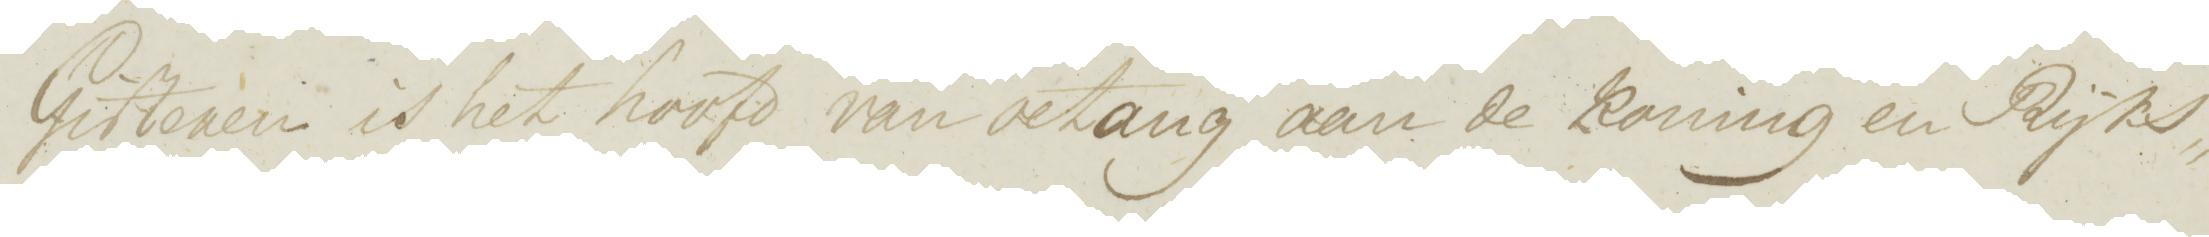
Gisteren is het hoofd van oetang aan de koning en Rijks„
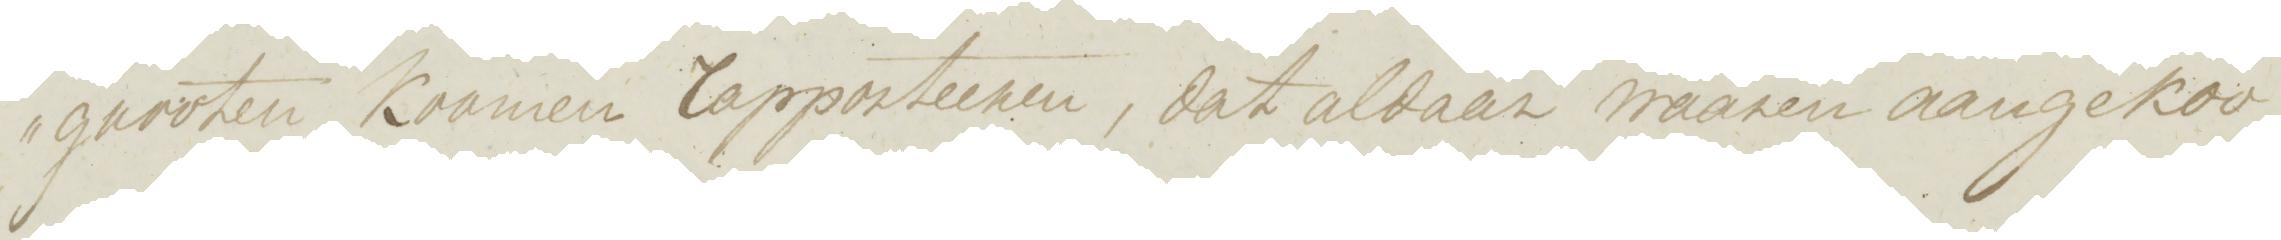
„grooten kormen rapporteeren, dat aldaar waaren aangekoo
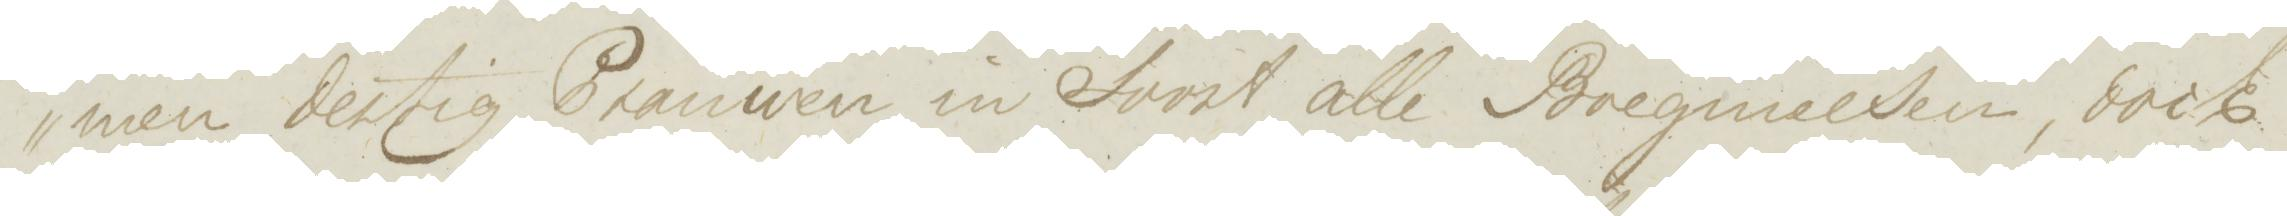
„men dertig Prauwen in soort alle Boegineesen, doch
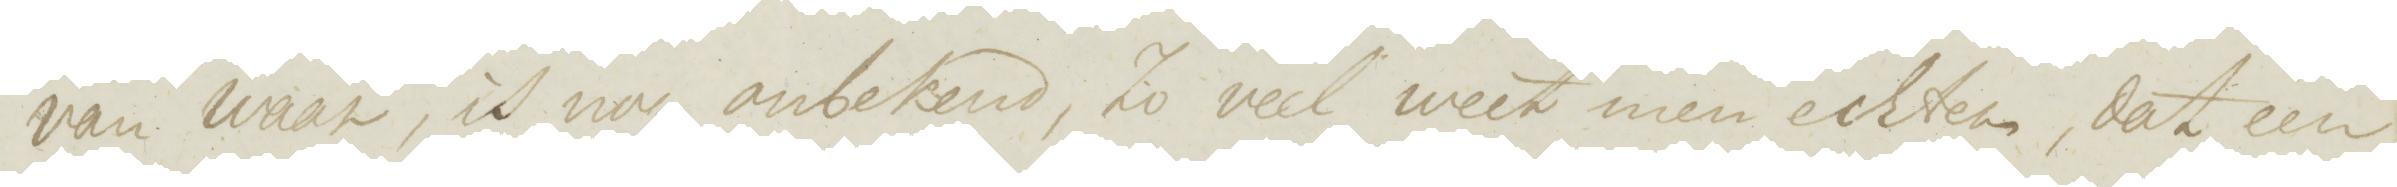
van waar, is nog onbekend, zo veel weet men echter, dat een
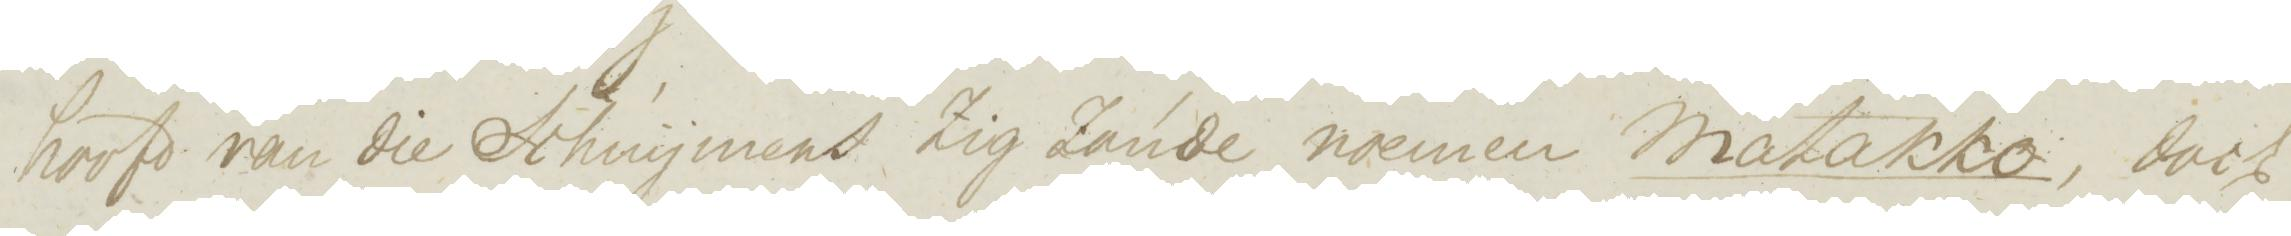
hoofd van die schuijmers zig zoude noemen matakko, doch
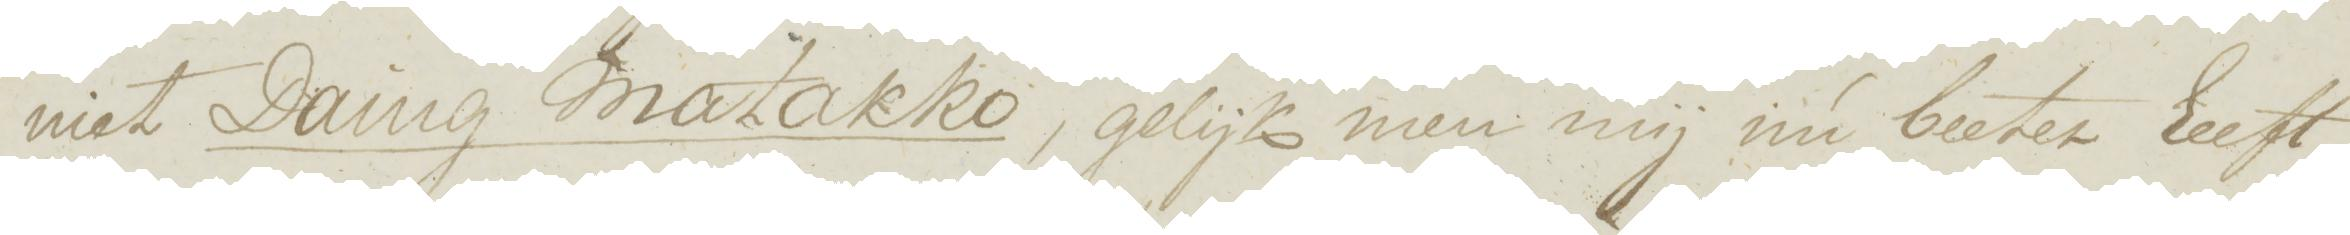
niet Daing matakko, gelijk men mij nu beeter heeft
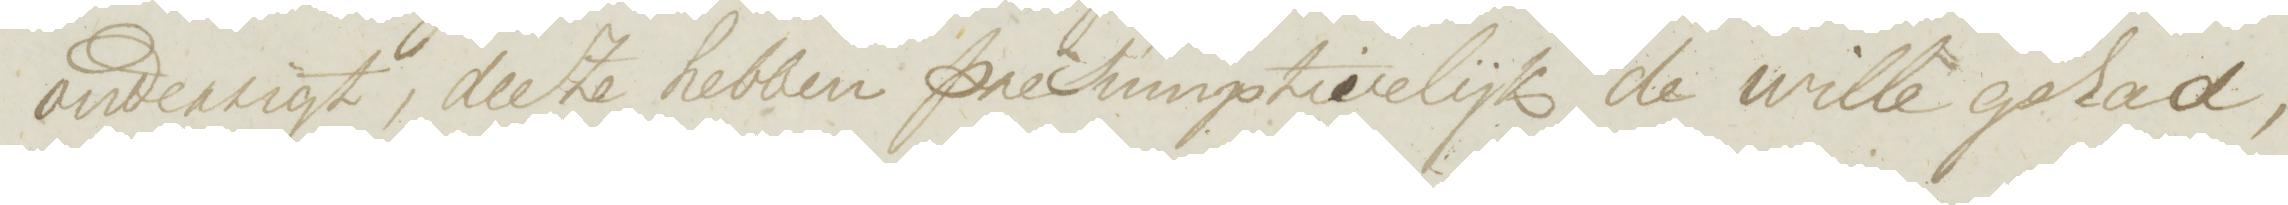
onderrigt, deeze hebben presumptivelijk de wille gehad,
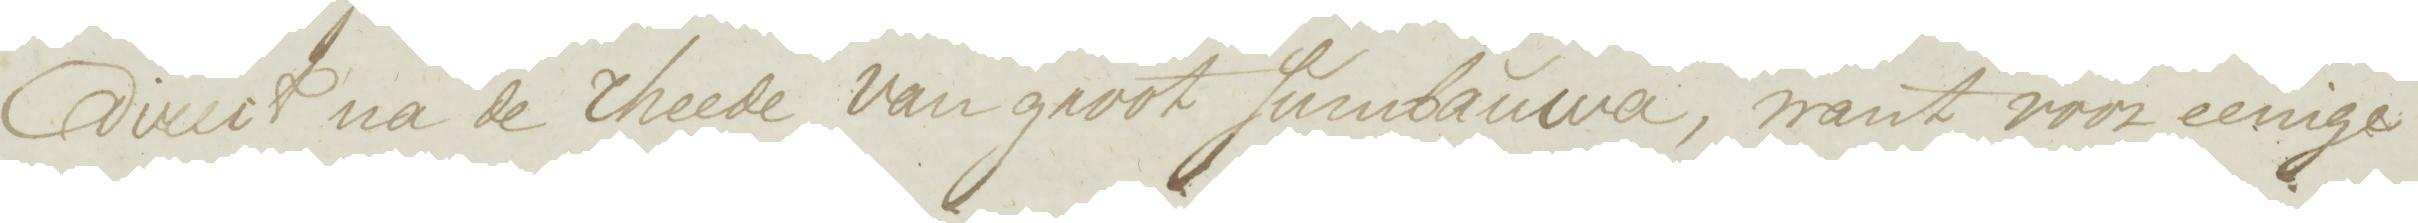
direct na de rheede van groot sumbauwa, want voor eenige
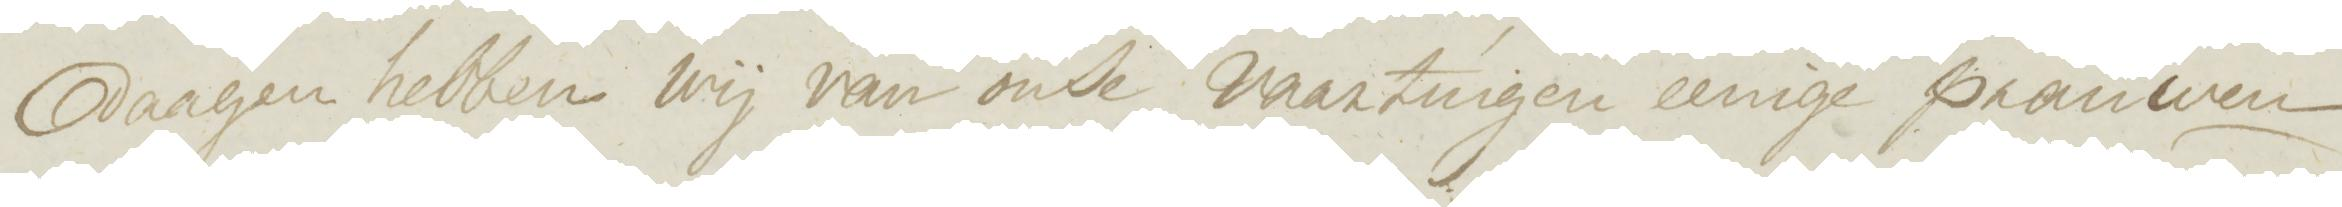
daagen hebben wij van onse vaartuigen eenige prauwen
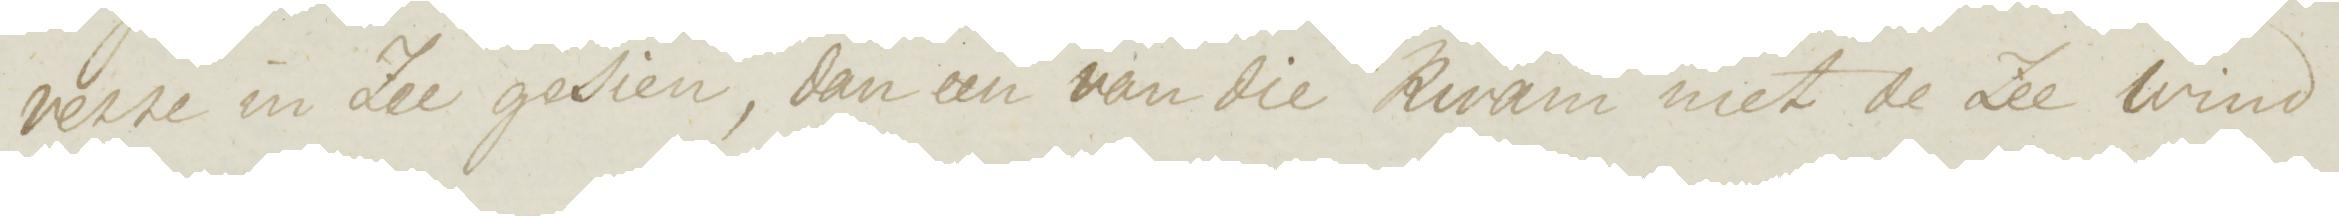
verre in zee gesien, dan een van die kwam met de zee wind
